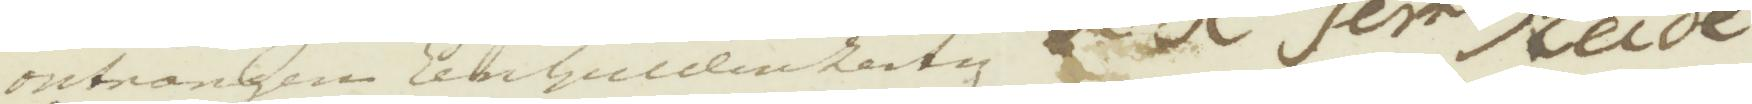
ontvangen Eenguldenzestig R R Ter Heide
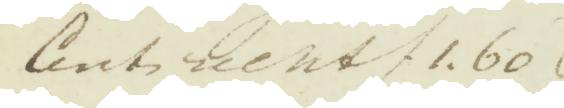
Cents recht ƒ 1.60
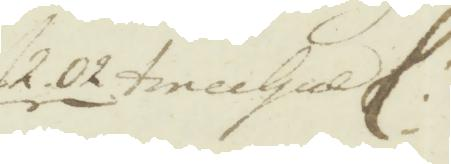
ƒ 2.02 twee Gul C.
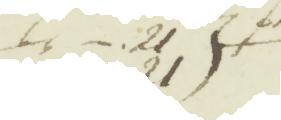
„ —. 21
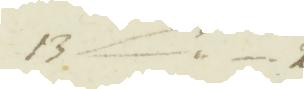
13 „ —. 21
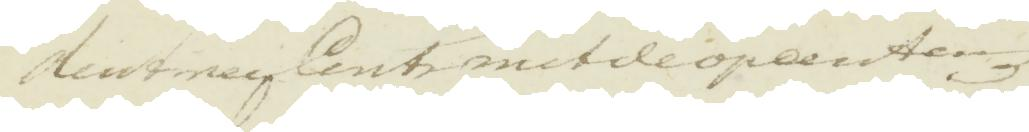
den twee Cents met de opcenten
